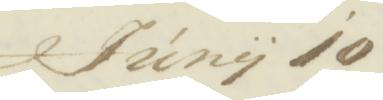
Junij 10
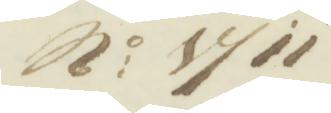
N:o 1711
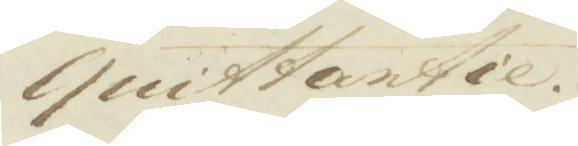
Quitantie.
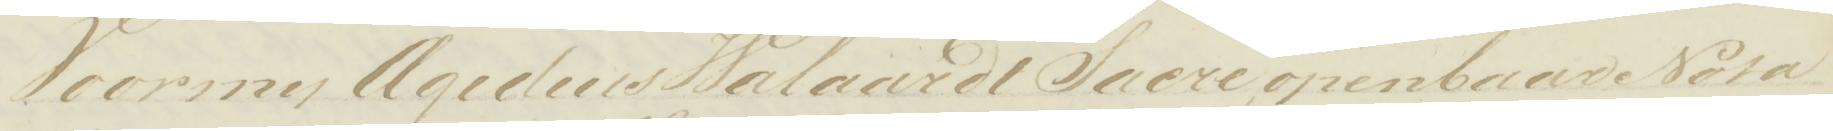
Voor my Agidius Walaardt Sacré, openbaar Nota
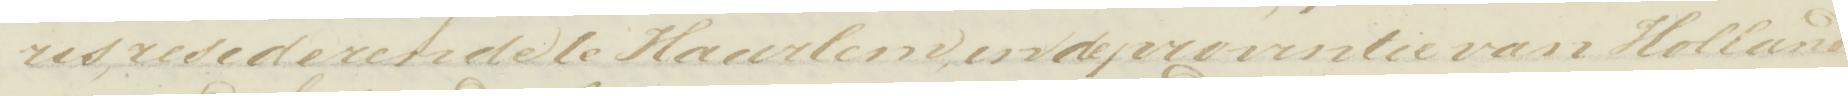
res residerende te Haarlem in de provintie van Holland
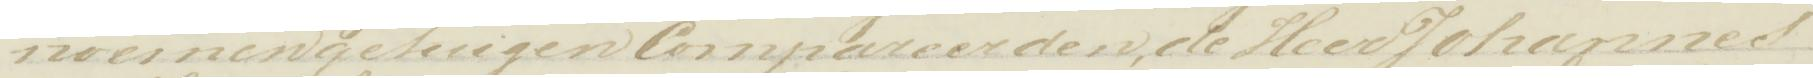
noemen getuigen Compareerden, de Heer Johannes
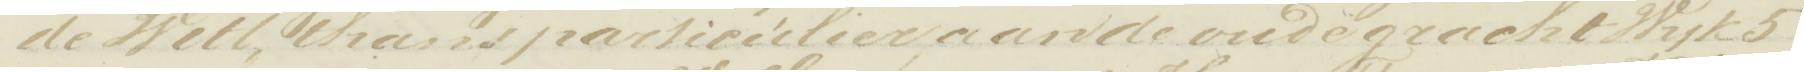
de Witt, thans particulier, aan de oude gracht Wyk 5
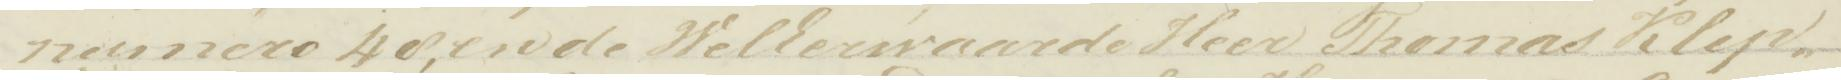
numero 48, en de Wel Eerwaarde Heer Thomas Klep„
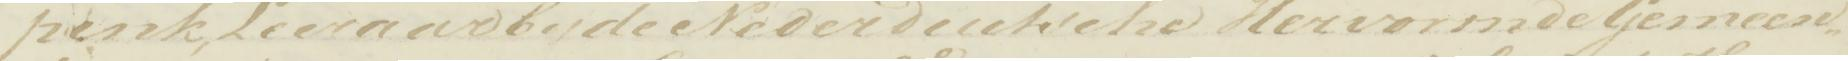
pink, Leeraar by de Nederdeutsche Hervormde Gemeen
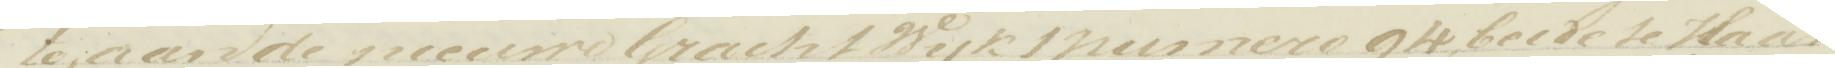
te aan de nieuwe Gracht Wyk 1 numero 94 beide te Haar
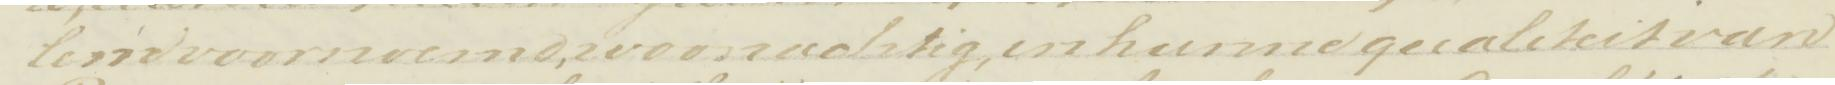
lem voornoemd, woonactig, in hunne qualiteit van
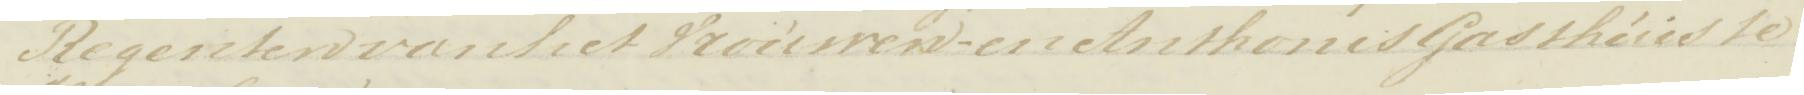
Regenten van het Vrouwen- en Anthonis Gasthuis te
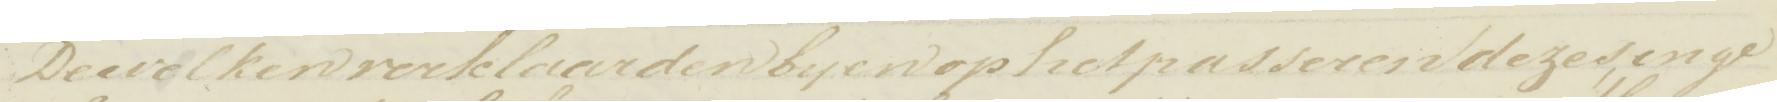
Dewelken verklaarden by en op het passeren dezes, en ge
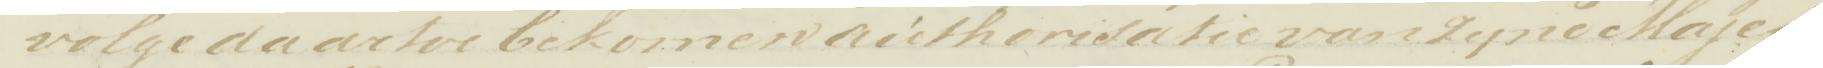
volge daar toe bekomen authorisatie van zyne Majes
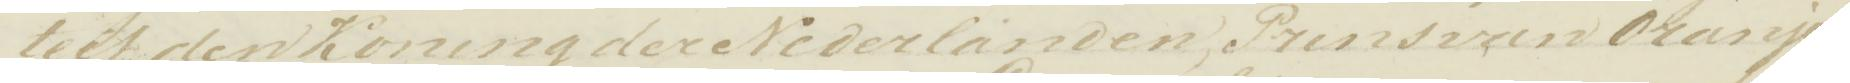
teit den Koning der Nederlanden, Prins van Oranje=
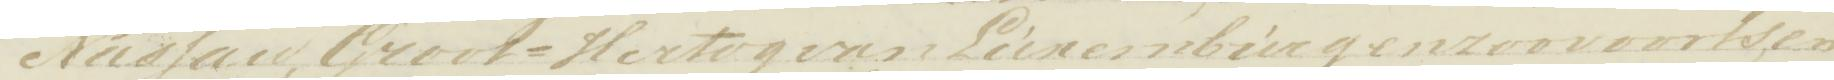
Nassau, Groot=Hertog van Luxemburg enzoovoorts, en,
